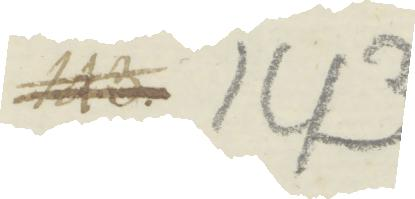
143 143
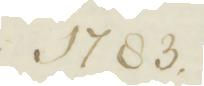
1783.
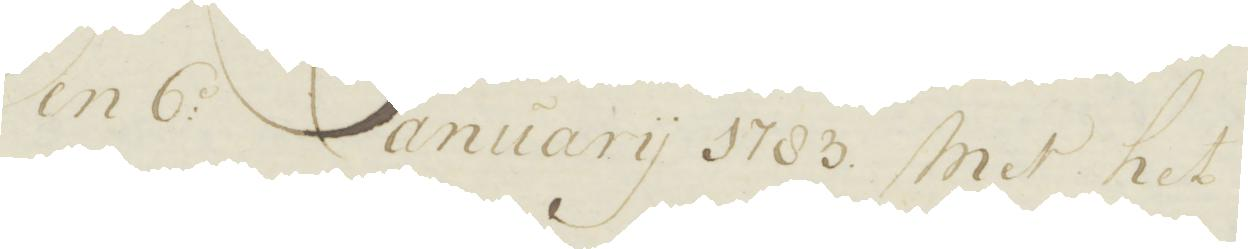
en 6:e Ianuarij 1783. met het
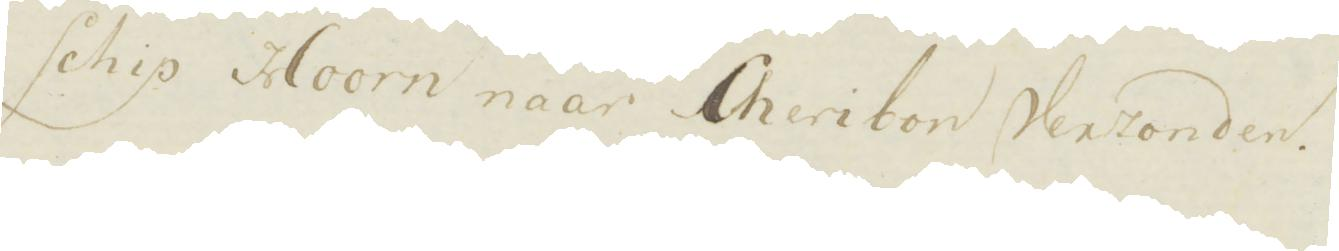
schip Hoorn naar Cheribon verzonden.
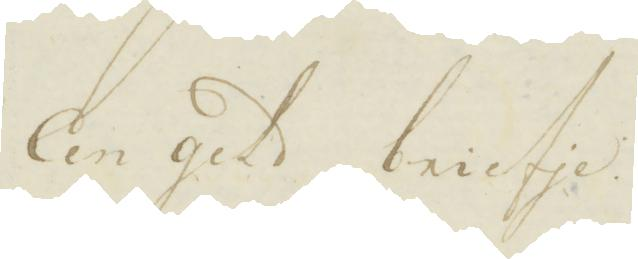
Een geld briefje:
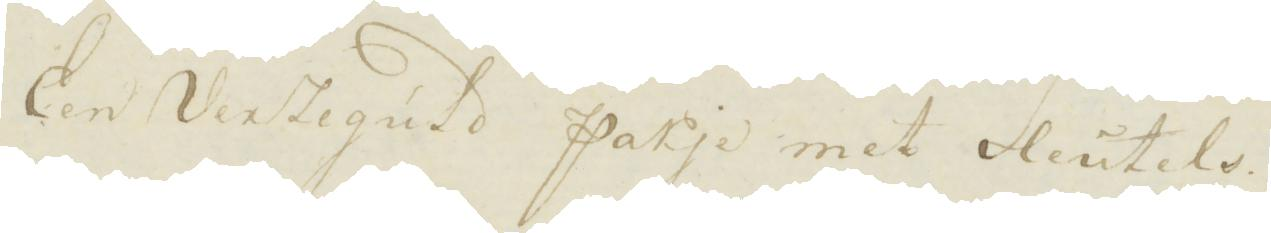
Een verzeguld pakje met sleutels.
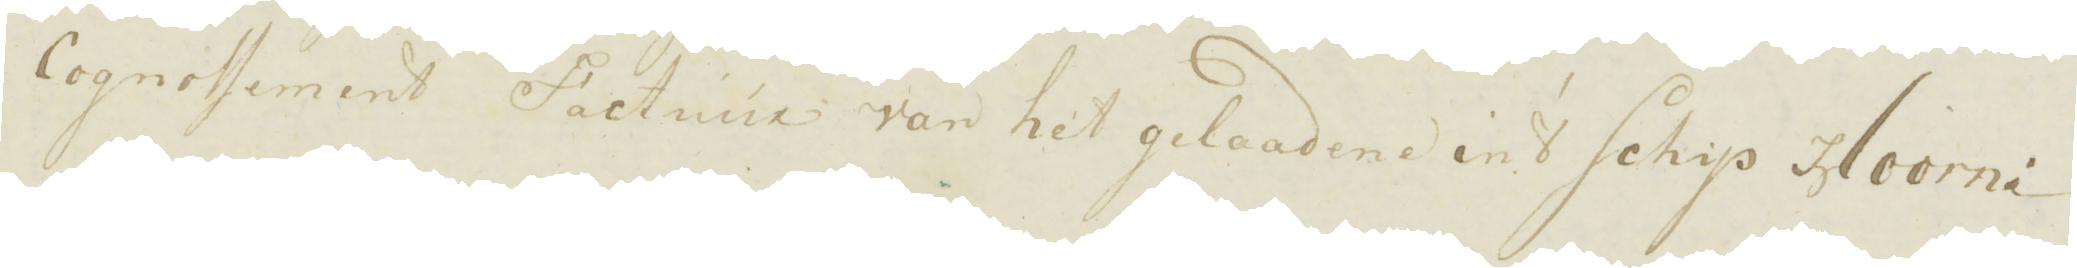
Cognossement Factuur van het gelaadene in ’t schip Hoorn:
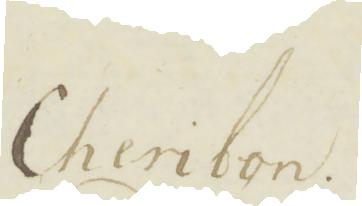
Cheribon.
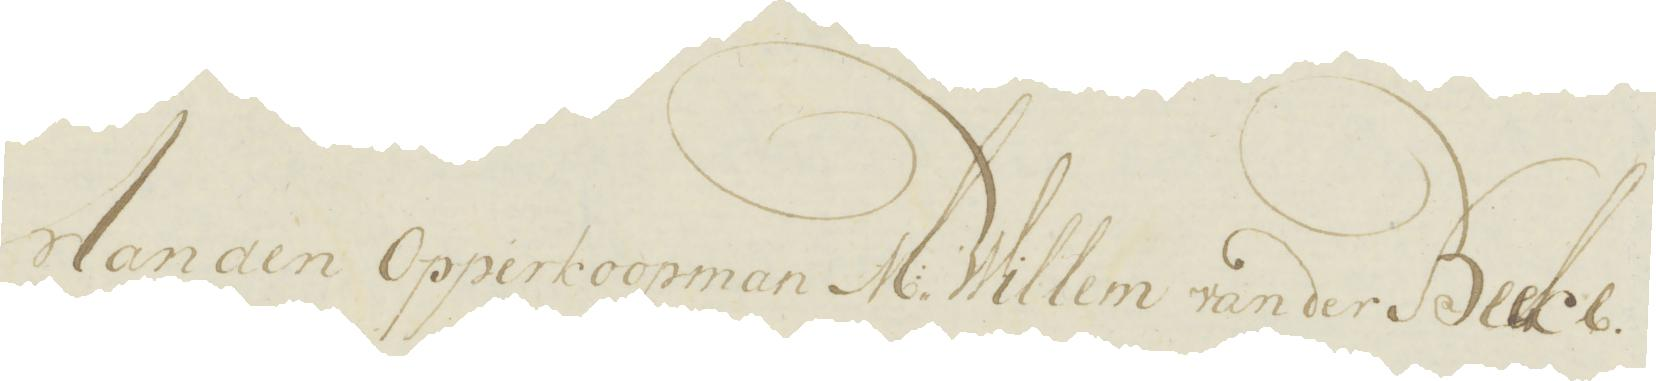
Aan den Opperkoopman M: Willem van der Beeke.
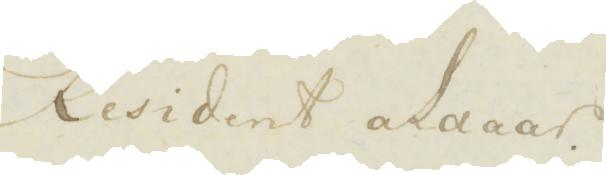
Resident aldaar.
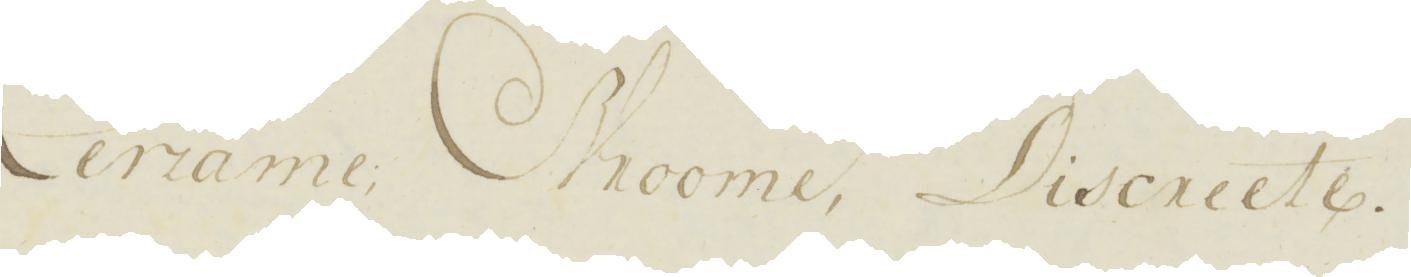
Eerzame, Vroome, Discreete.
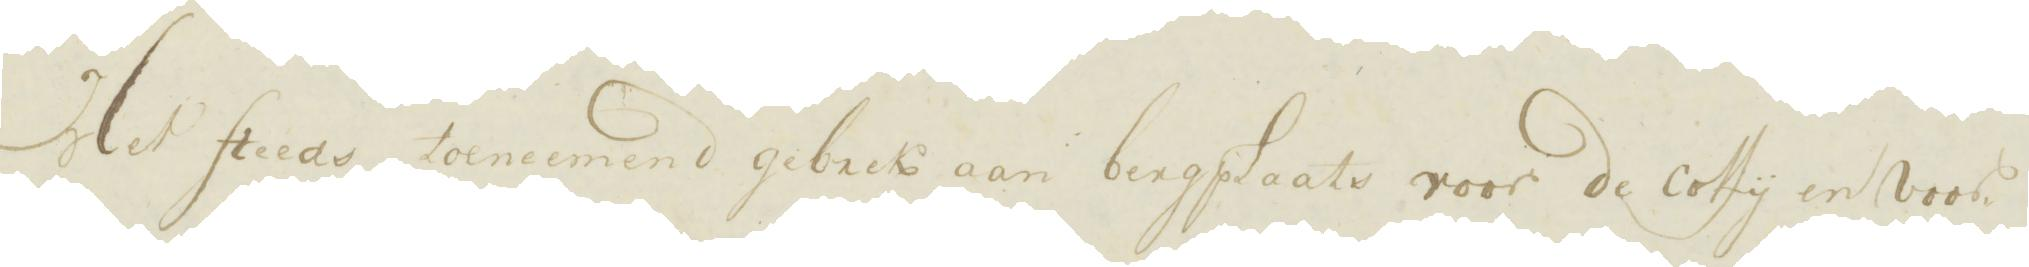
Het steeds toeneemend gebrek aan bergplaats voor de coffij en voor
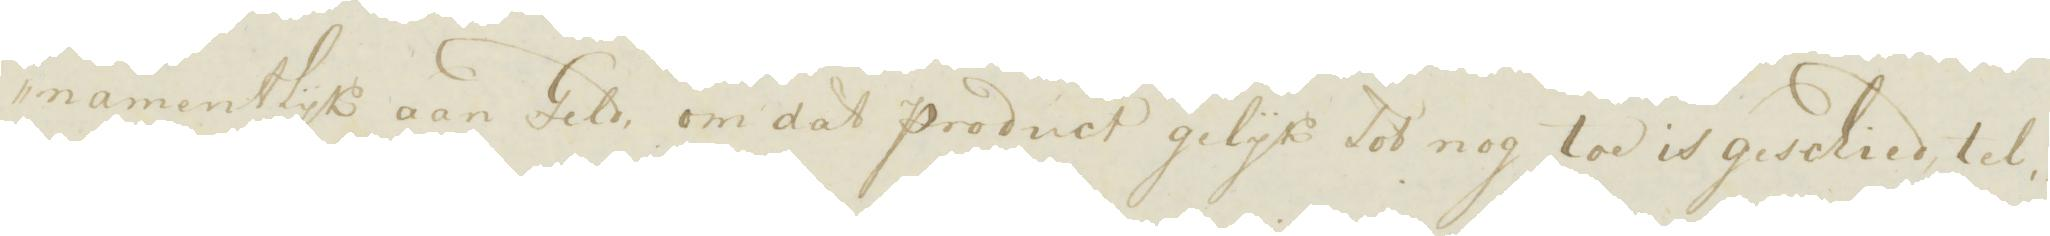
namentlijk aan Geld om dat product gelijk tot nog toe is geschied, tel,
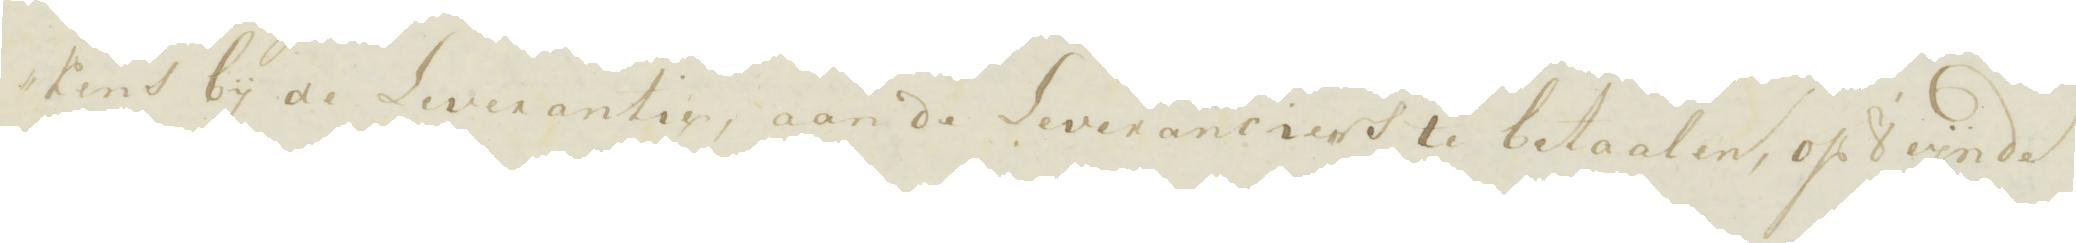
„kens bij de Leverantie aan de Leveranciers te betaalen, op 't eijnde
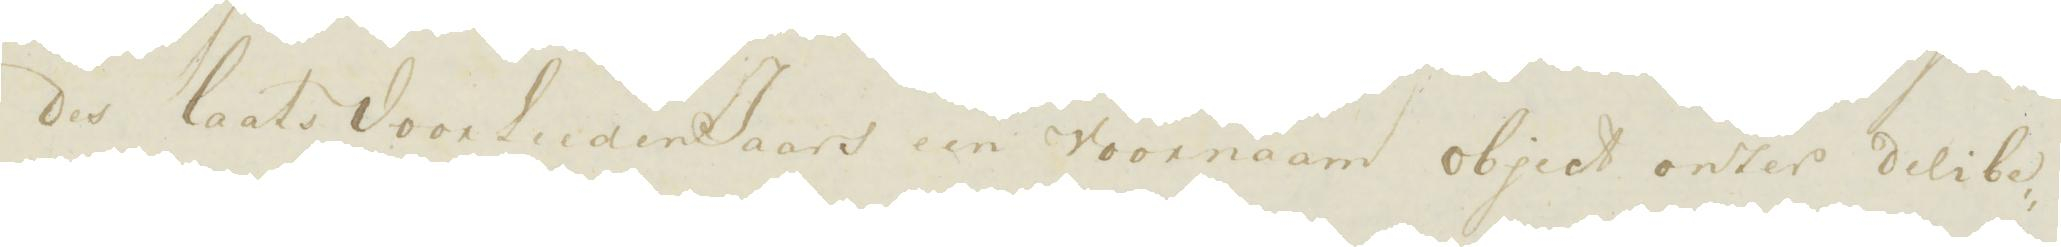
des laats voorleeden Iaars een voornaam object onzer delibe„
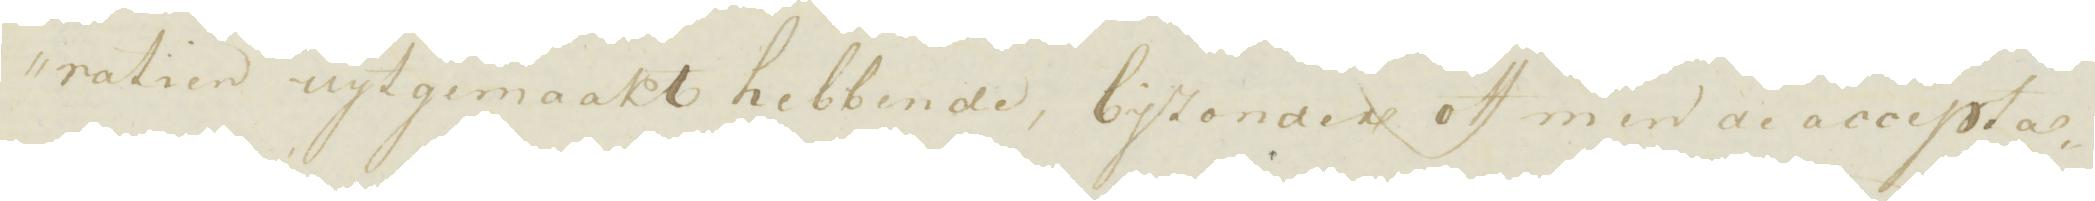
„ratien uijtgemaakt hebbende, bijzonder off men de accepta„
